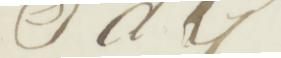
P d G
